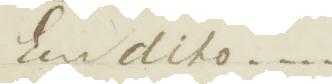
Een dito . . . .
